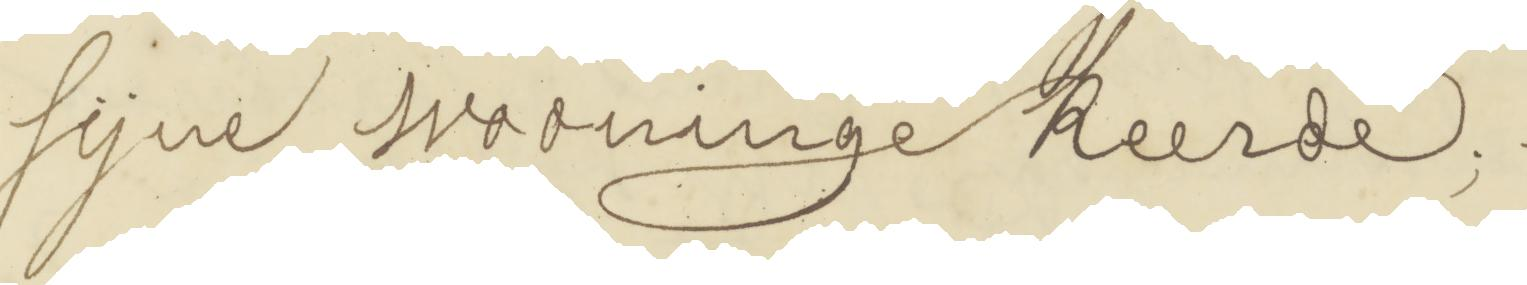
sijne wooninge keerde.
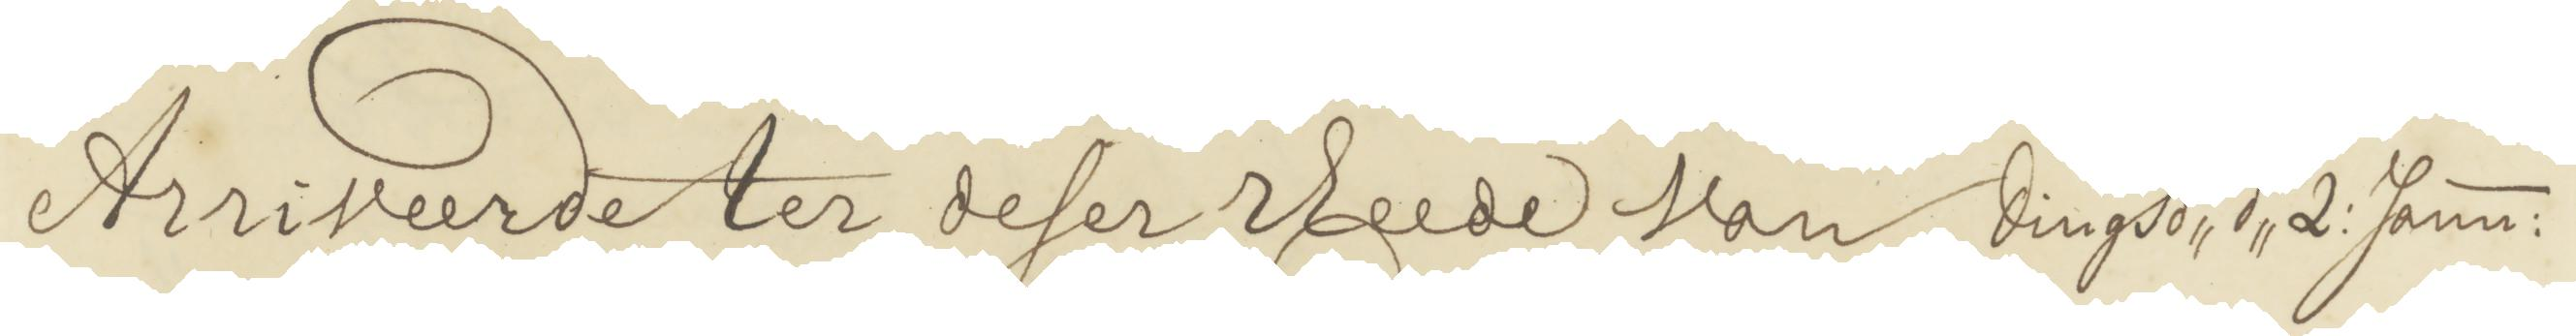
Arriveerde ter deser rheede van dingsd„g d„n 2: Jann:
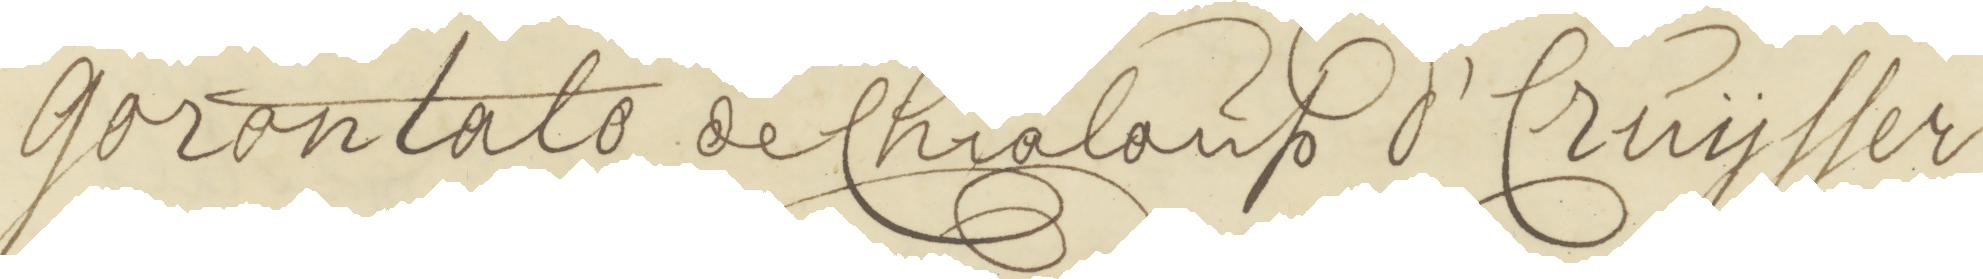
gorontalo de Chialoup d’ Cruijsser
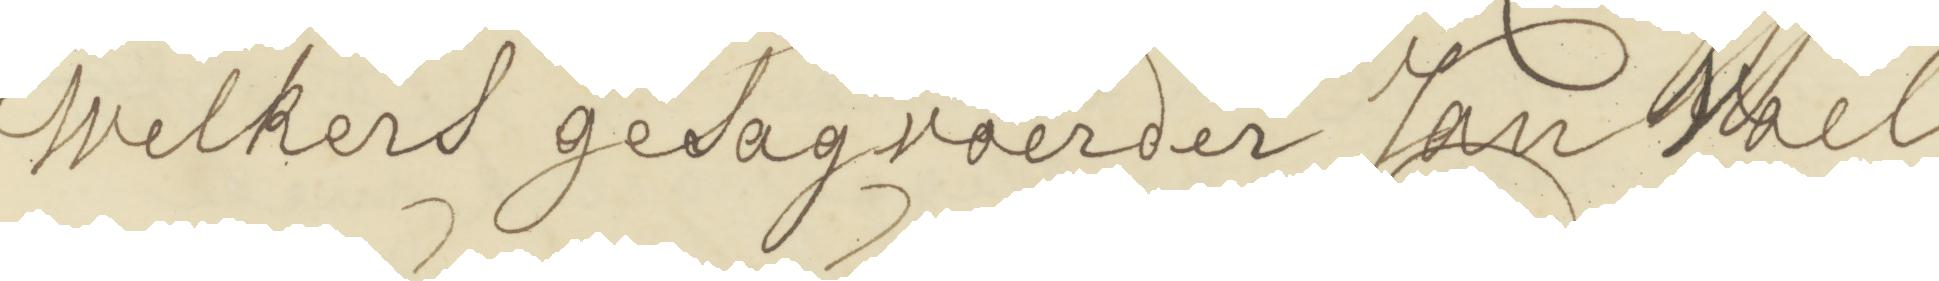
welkers gesagvoerder Jan Vael
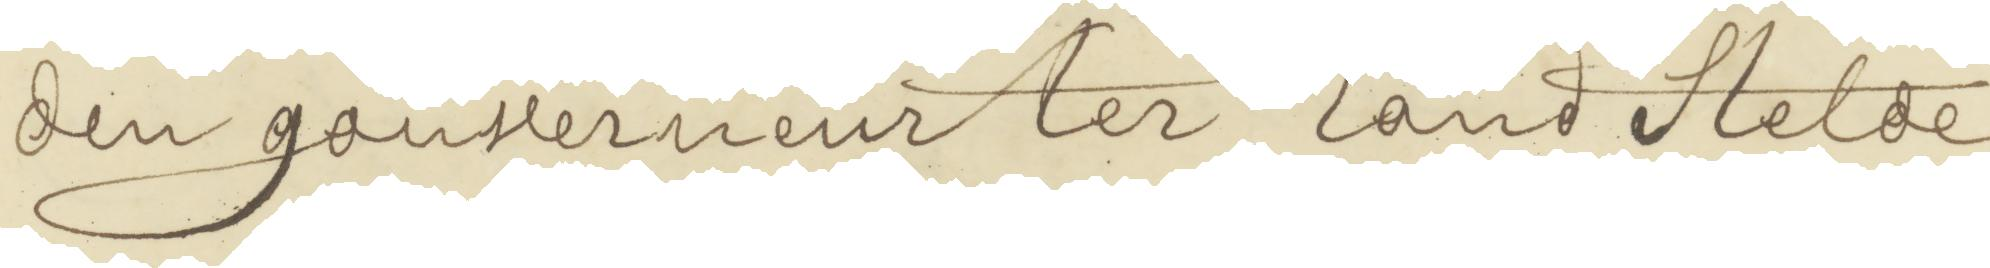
den gouverneur ter land stelde
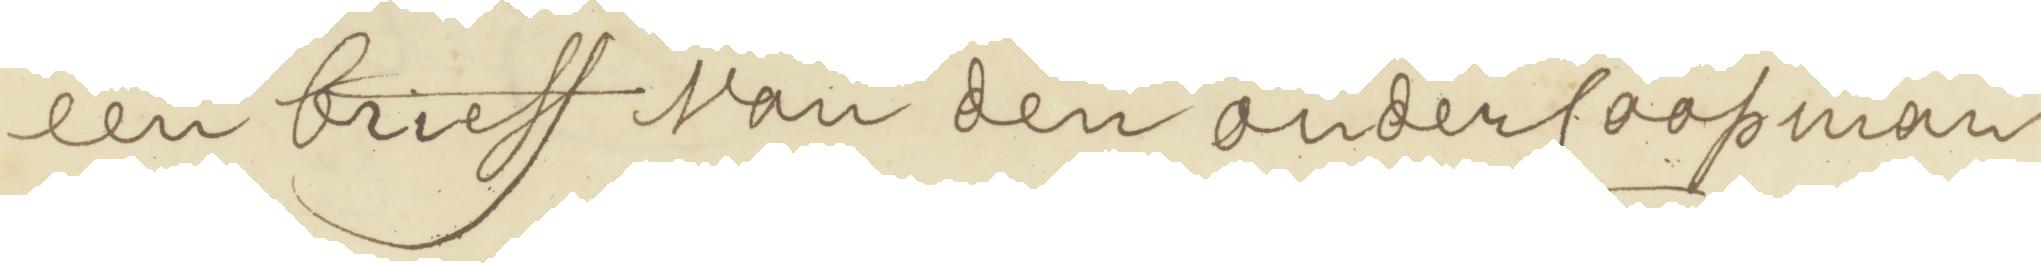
een brieff van den ondercoopman
